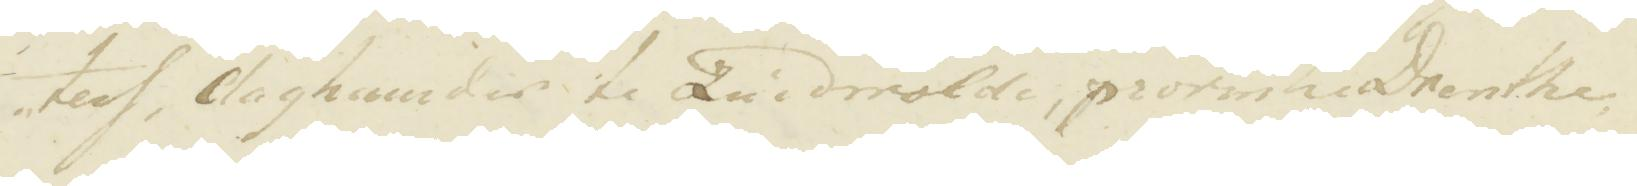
„ters, daghuurder te Zuidwolde, provintie Drenthe,
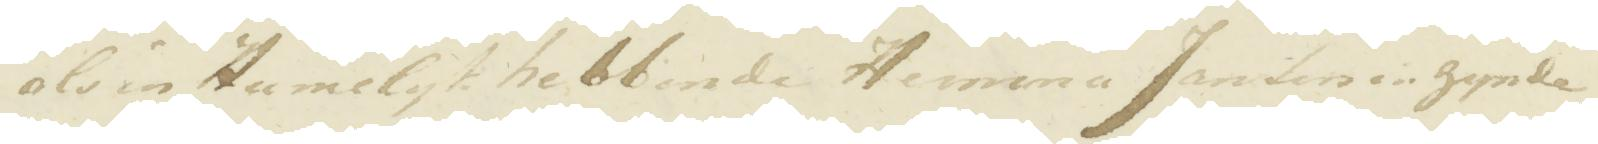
als in Huwelijk hebbende Hermina Jansen en zynde
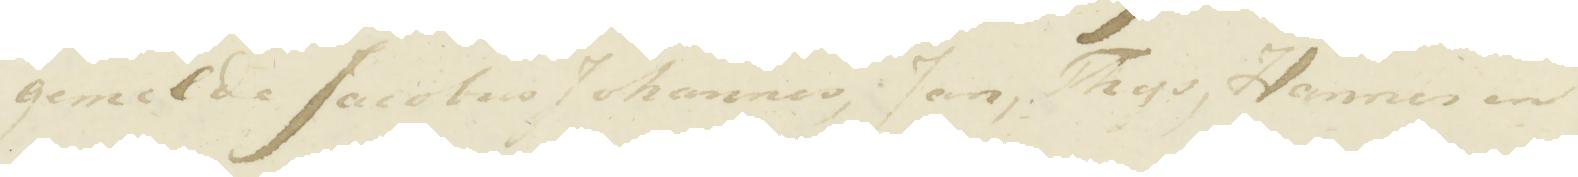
gemelde Jacobus Johannes, Jan, Thys, Hannes en
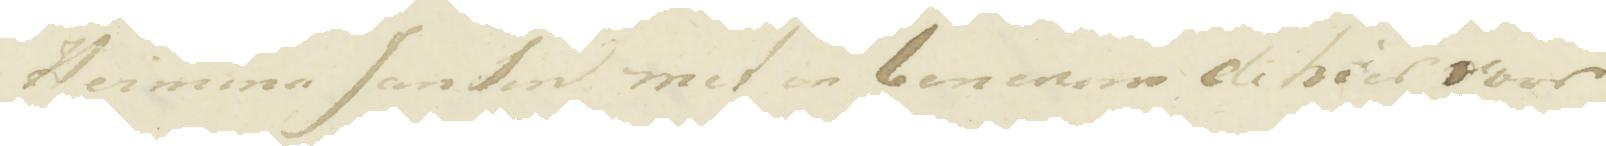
Hermina Jansen met en benevens de hier voor
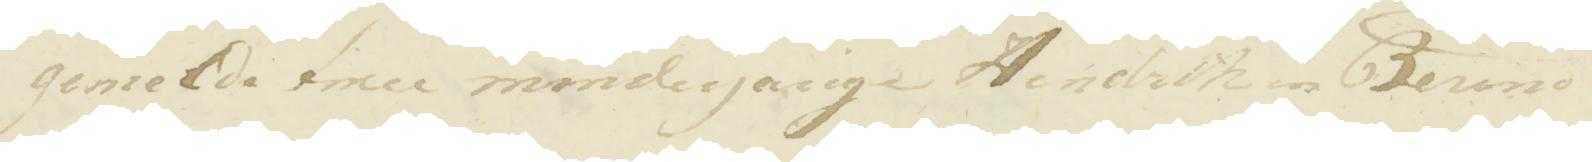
gemelde twee minderjarige Hendrik en Berend
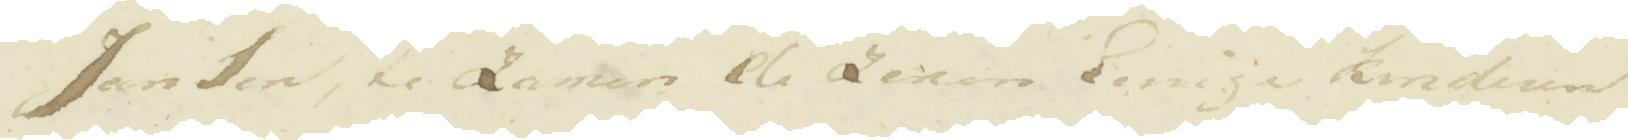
Jansen, te Zamen de Zeven Eenige kinderen
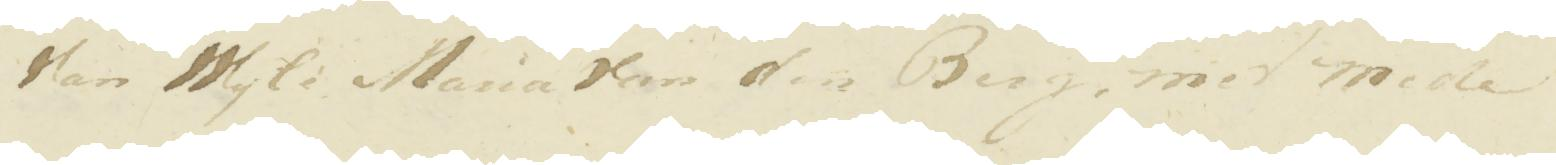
Van Wijle Maria van den Berg, met mede
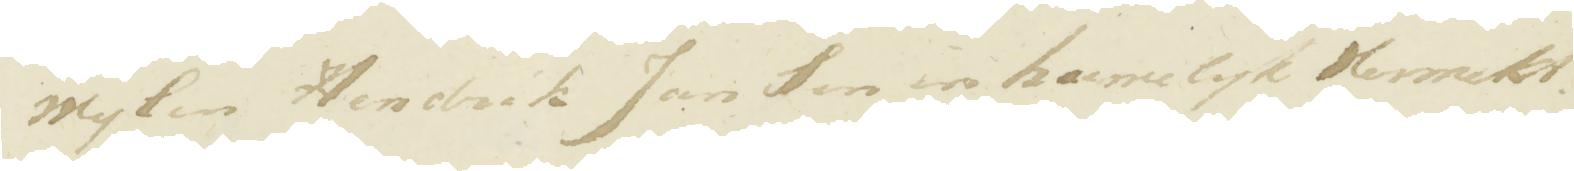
wylen Hendrik Jansen in huwelyk verwekt.
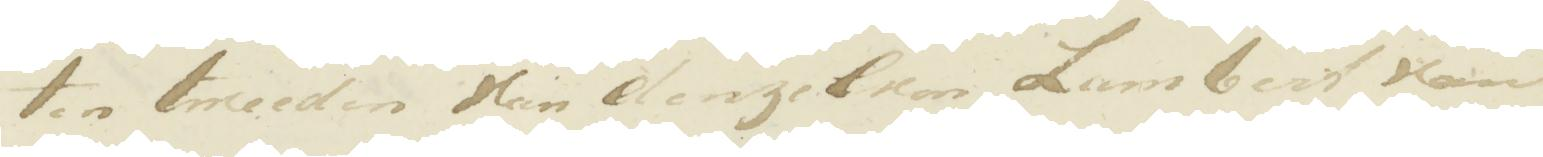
ten tweeden van denzelven Lambert van
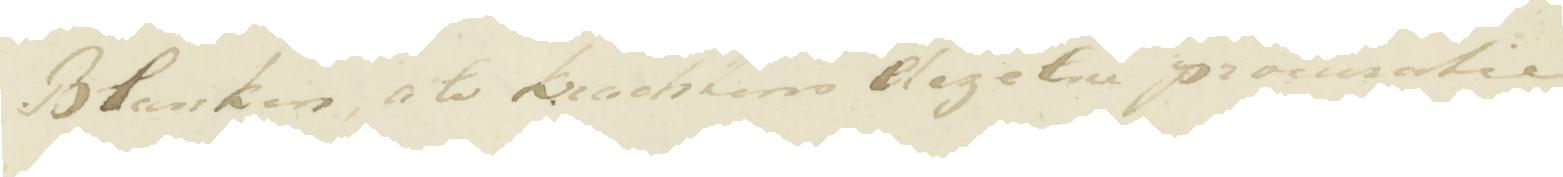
Blanken, als krachtens dezelve procuratie
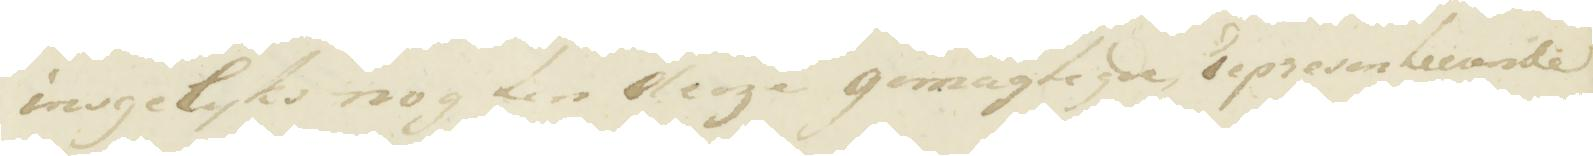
insgelyks nog ten deeze gemagtigde, Representeerende
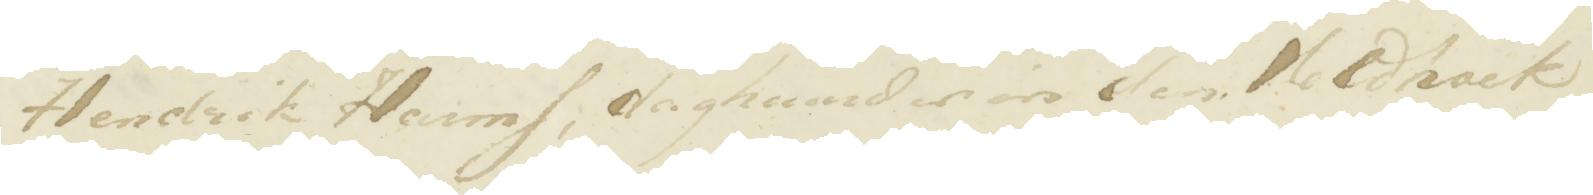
Hendrik Harms, daghuurder in den Veldhoek,
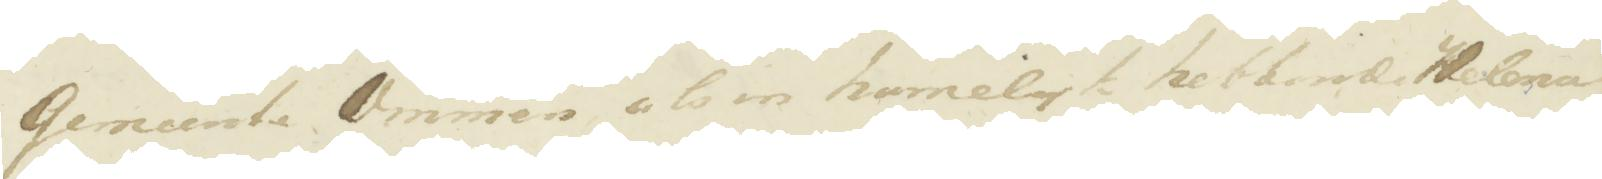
Gemeente Ommen, als in huwelijk hebbende Helena
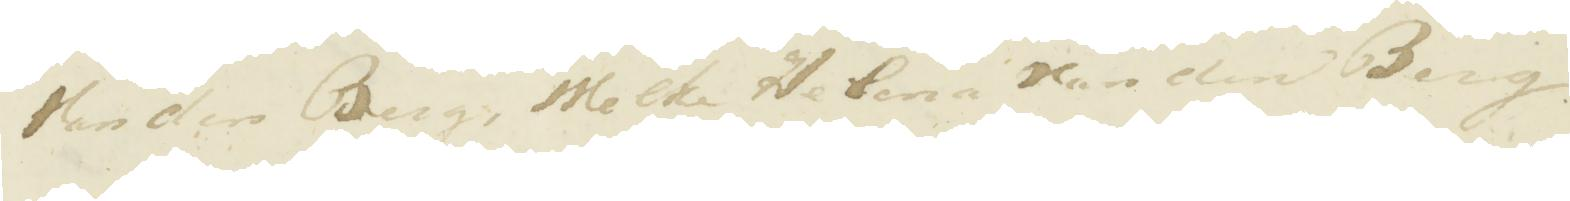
van den Berg, Welke Helena van den Berg
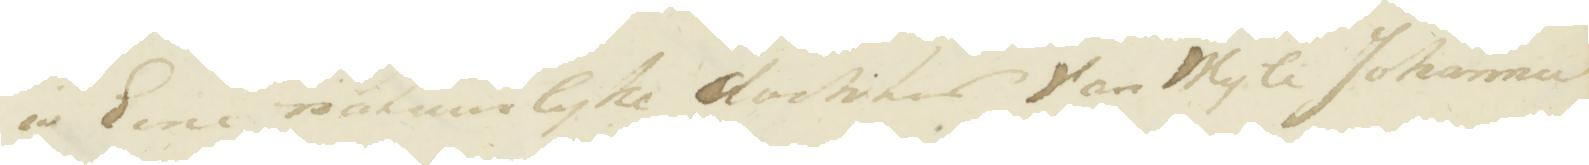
is Eene natuurlyke dochter van Wyle Johanna
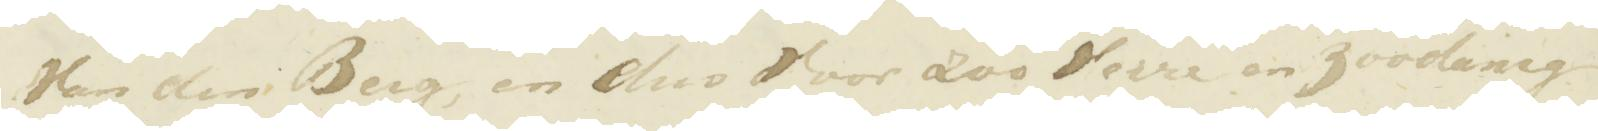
van den Berg, en dus voor zoo verre en zoodanig
